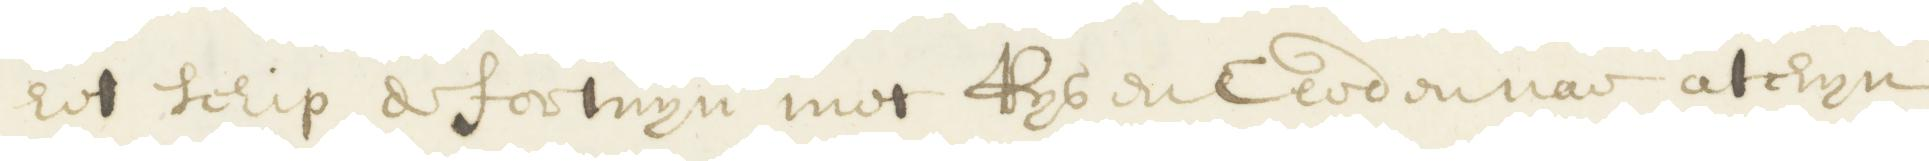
het schip de fortuijn met Rys en Cleden nae atchijn
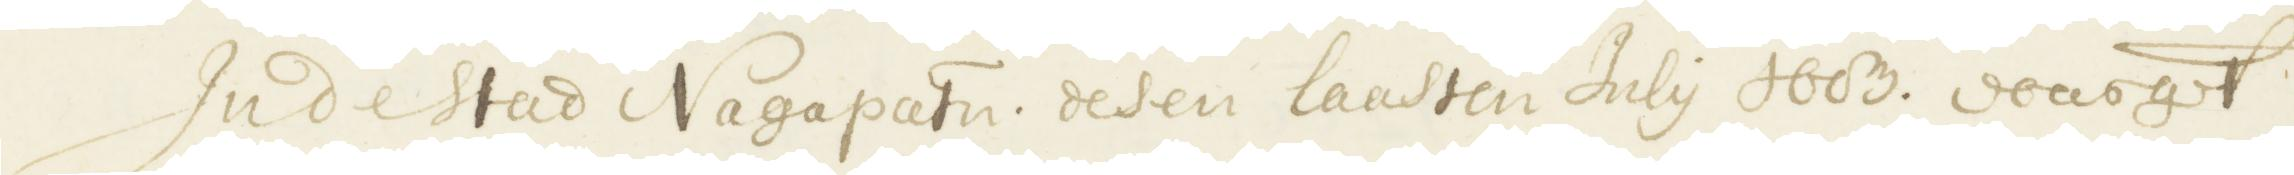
Jn de stad Nagapatn. desen laasten Iulij 1683. was get
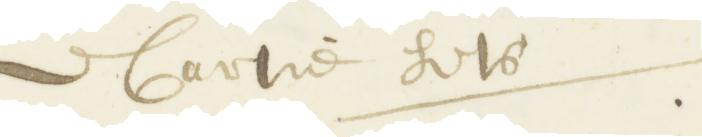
Carlie fels
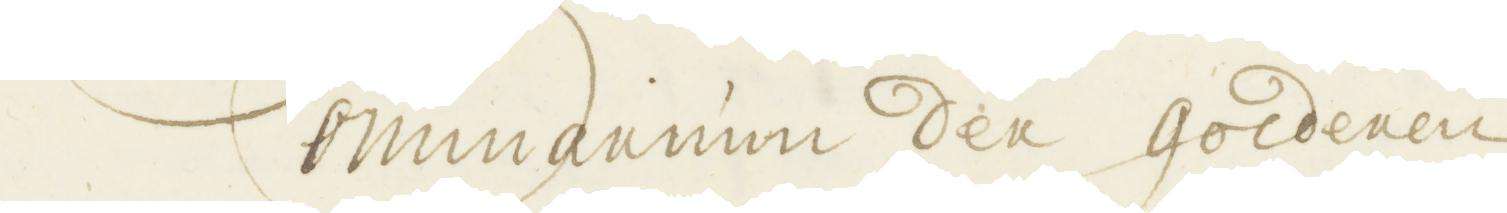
Sommarium der goederen
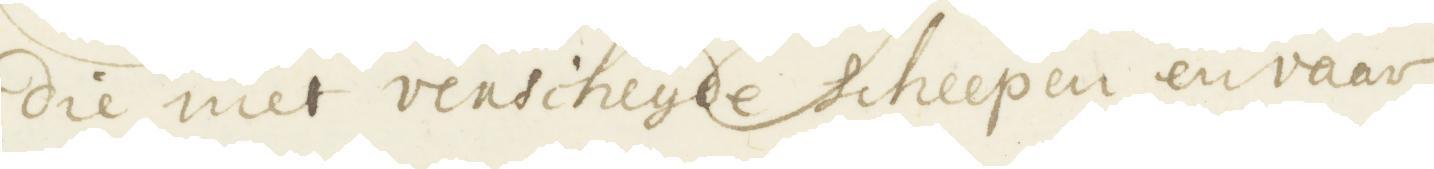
die met verscheijde scheepen en vaar,
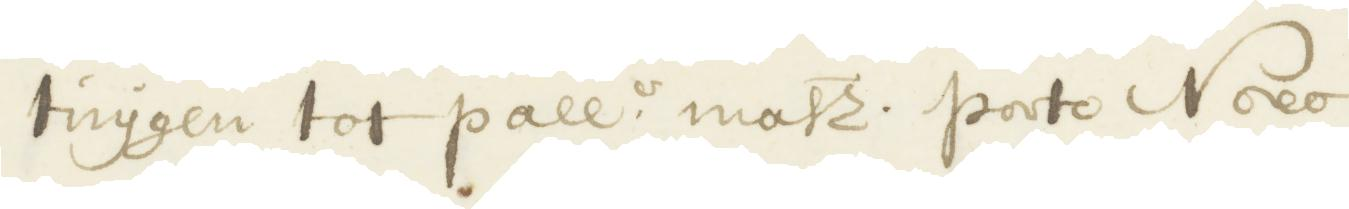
tuijgen tot pall:e masz. porto Novo
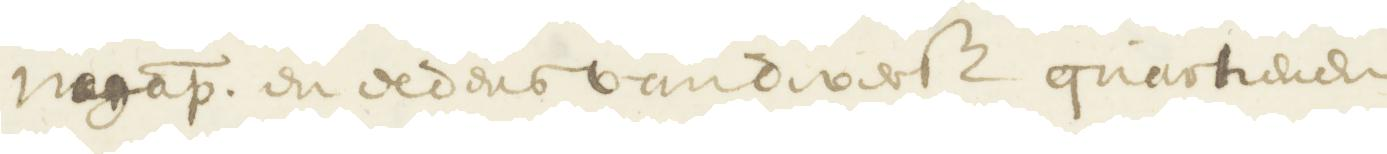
nagap. en elders van divers quartieren
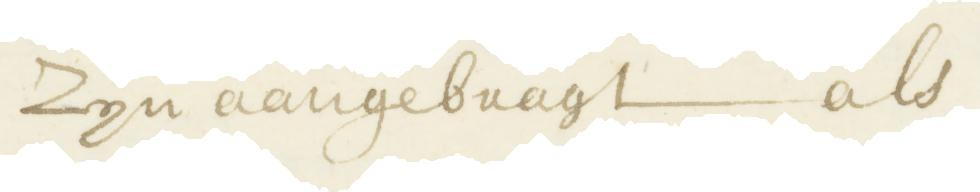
zijn aangebragt als
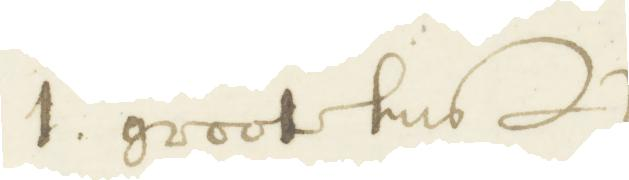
1. groote kust
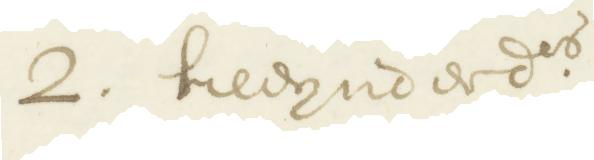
2. kleijnder d:os
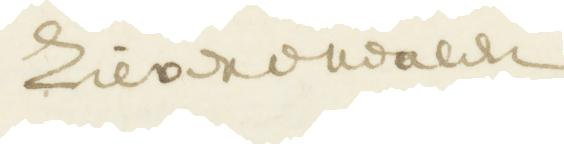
Zilvere realen
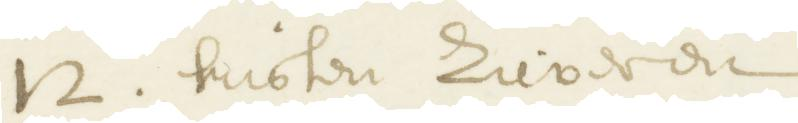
12. kisten zilveren
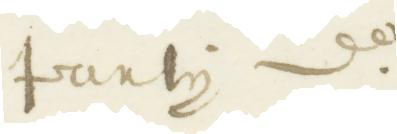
partij d.o
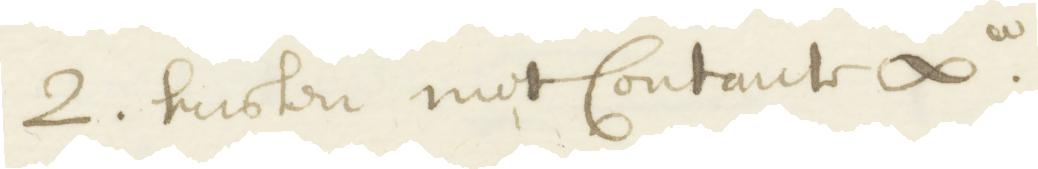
2. kisten met Contante ∞en.
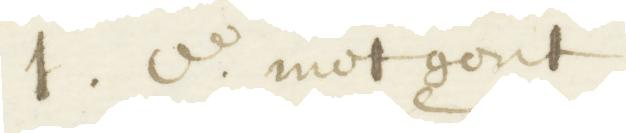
1. d.o met gout
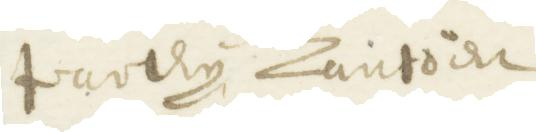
parthij zautden
